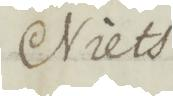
Niets
